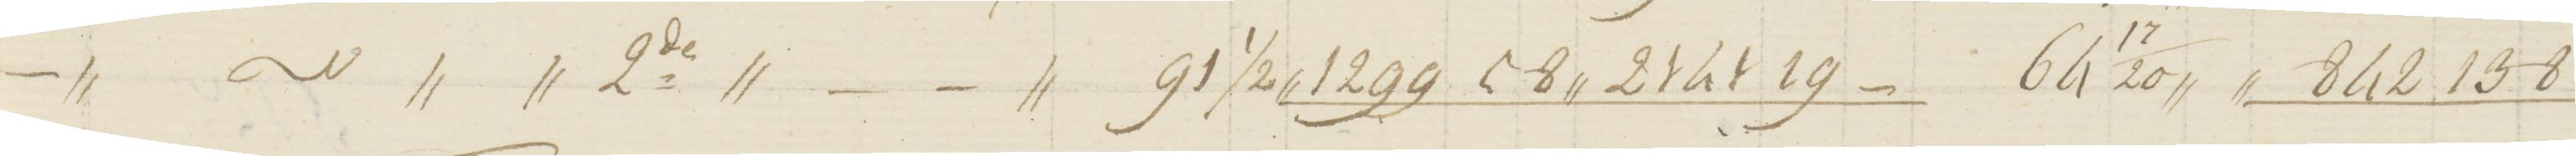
- „ _o „ „ 2=de „ - „ 91½ „ 1299 58 „ 2141 19 - 64 17/20 „ „ 842 13 8
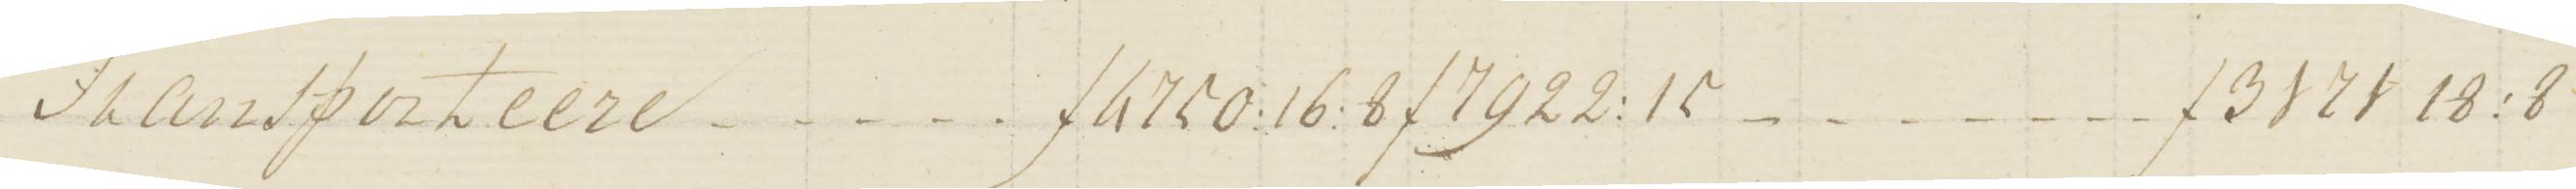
Transporteere - - - - - ƒ 4750:16:8 ƒ 7922:15 - - - - - ƒ3171 18:8:
